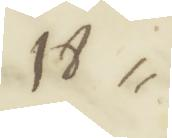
18 „
